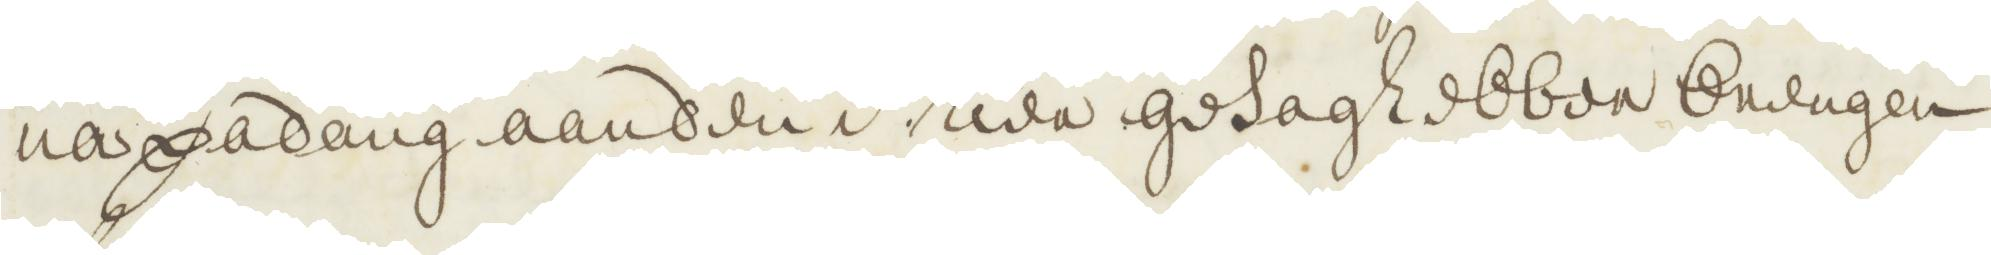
na padang aan den E. heer gesaghebber brengen
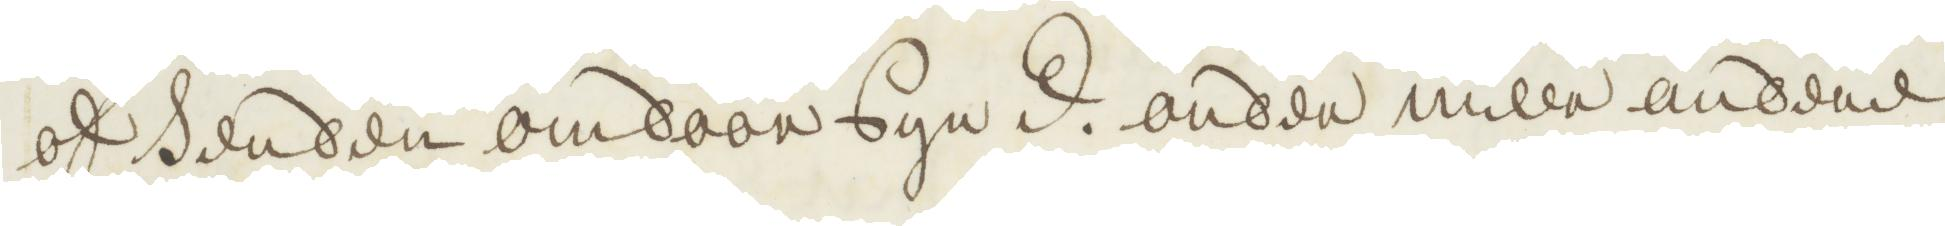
of senden om door sijn E. onder meer andere
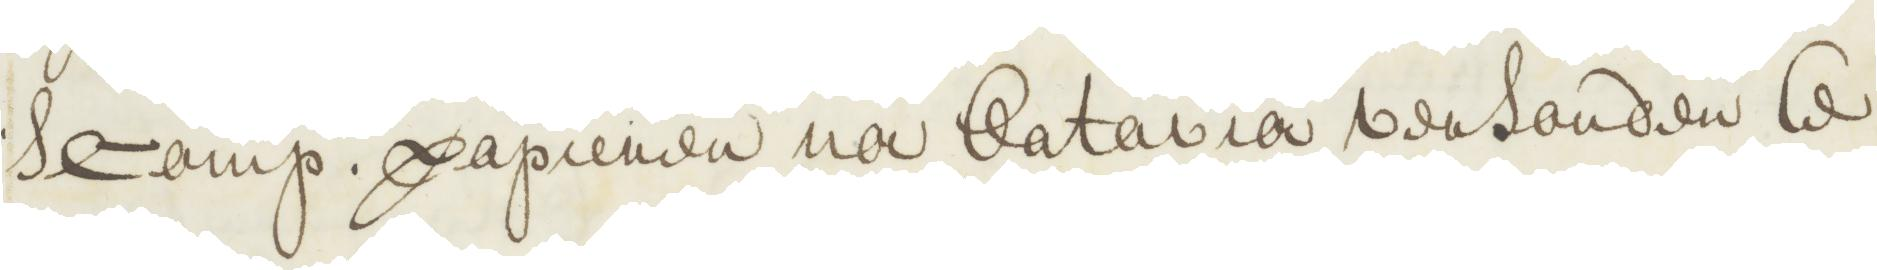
’sComp.s papieren na batavia versonden te
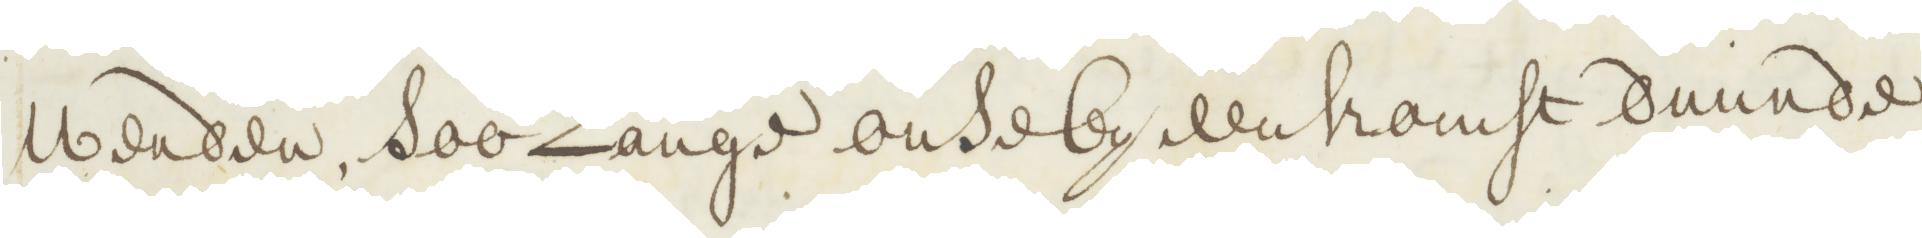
werden, soo Lange onse byeenkomst duurde
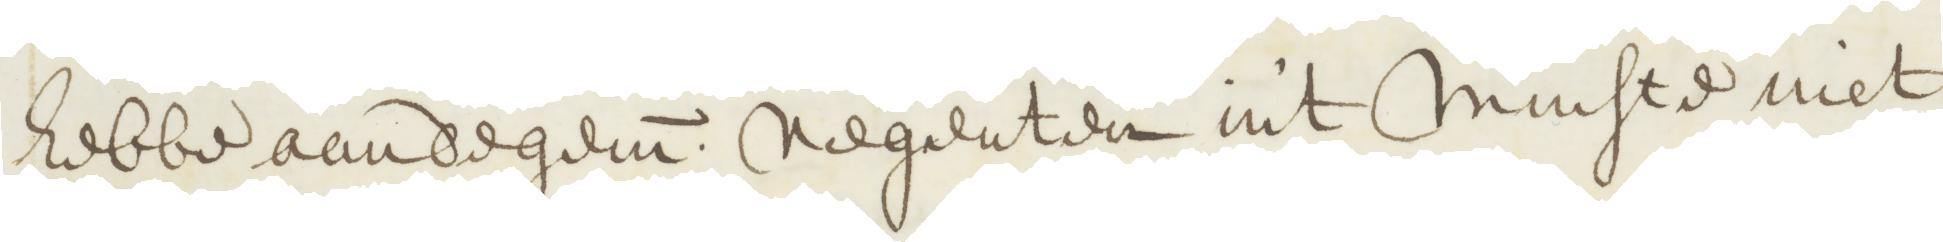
hebbe aan de gem. regenten in’t minste niet
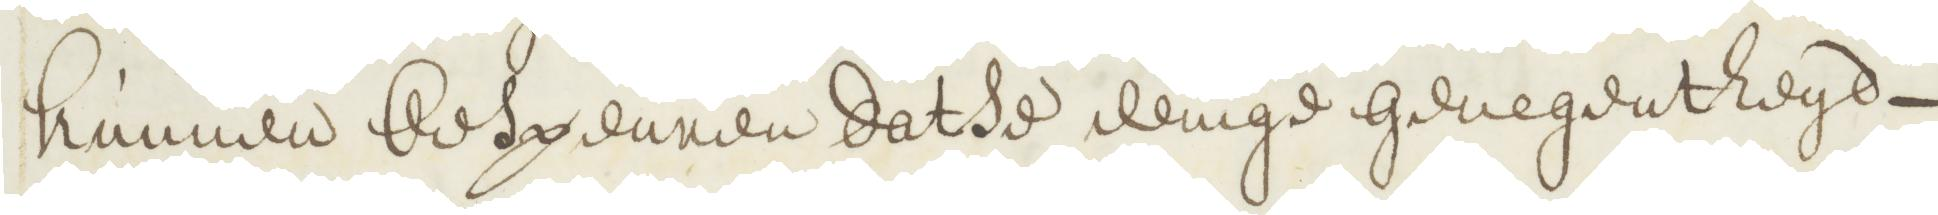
kunnen bespeuren datse eenige genegentheyd
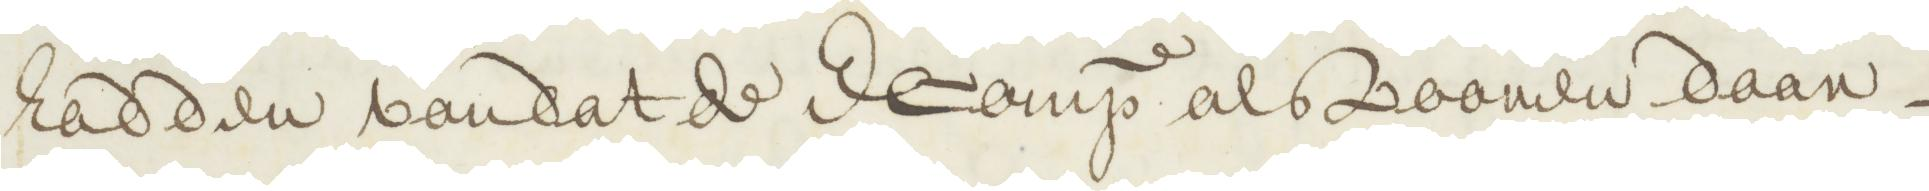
hadden van dat de EComp:e als vooren daar
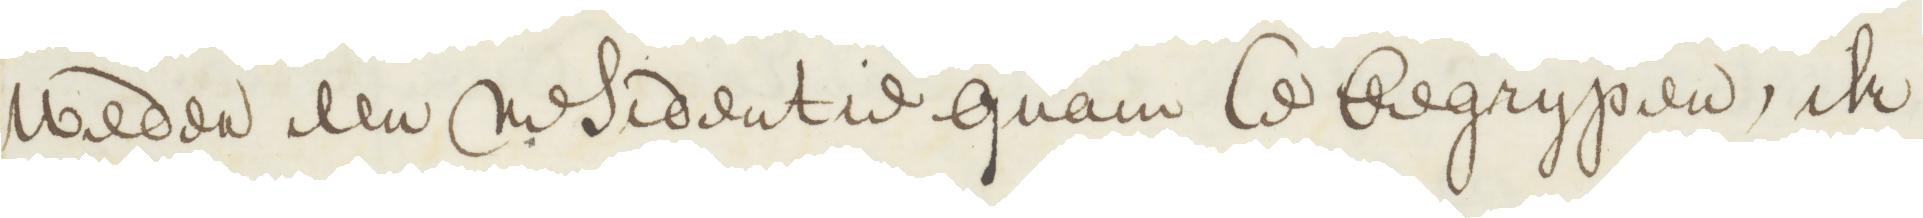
weder een residentie quam te begrijpen, ik
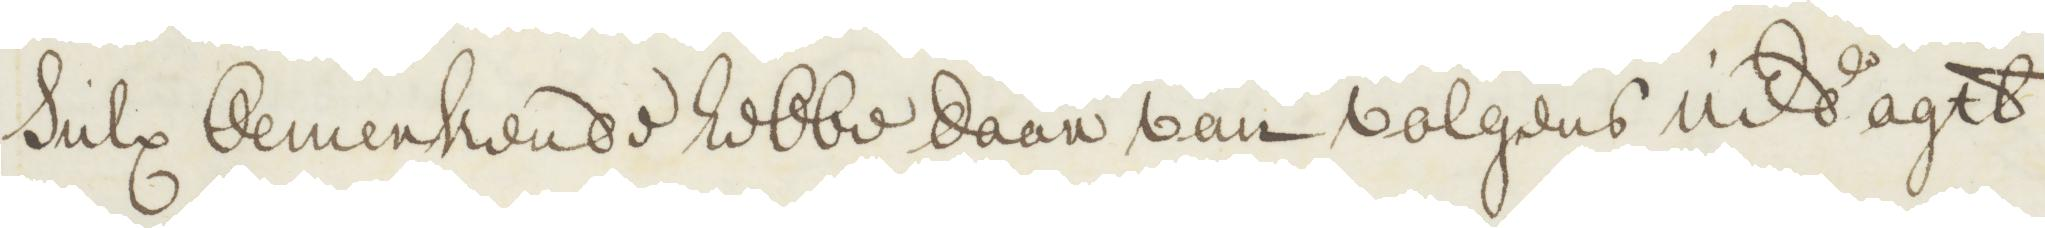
sulx bemerkende hebbe daar van volgens uEd.le agtb
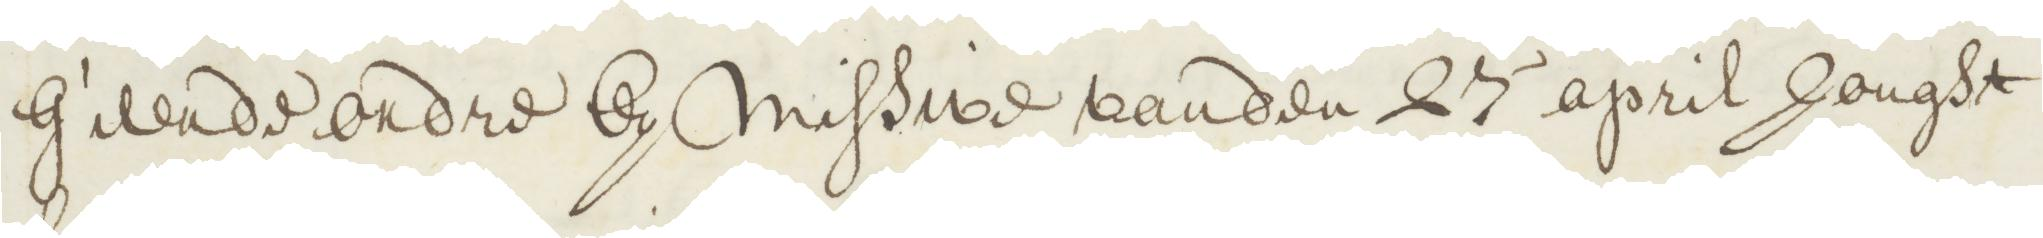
g'eerde ordre by missive van den 27' April jongst
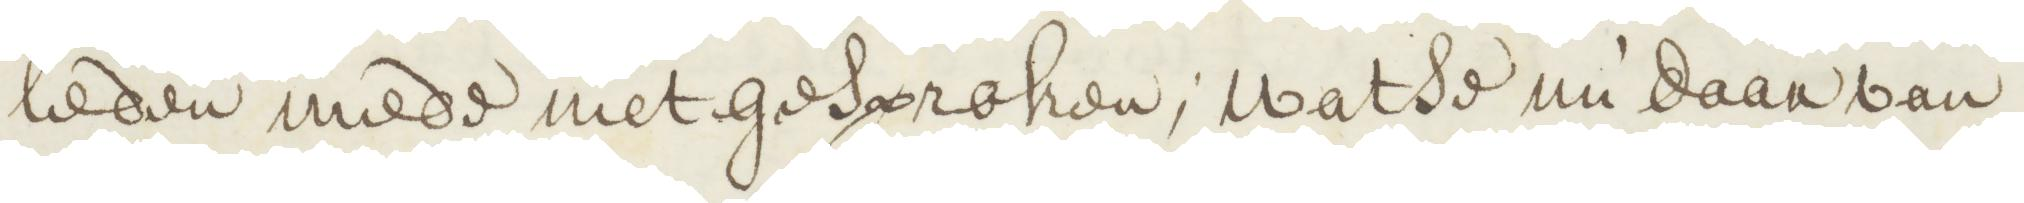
leden mede niet gesproken; watse nu daar van
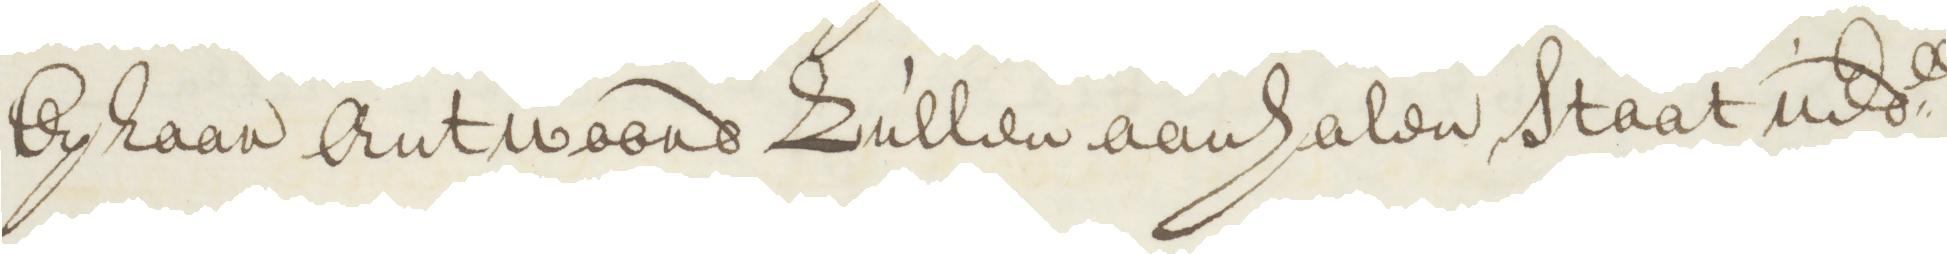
by haar antwoord Zullen aanhalen, staat uEd„le
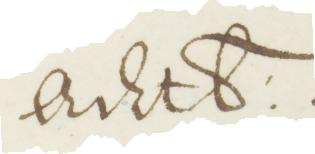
Achtb:.
